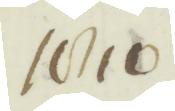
1810
